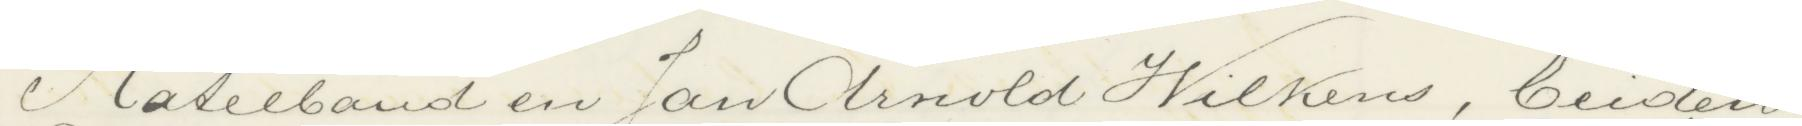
Ratelband en Jan Arnold Wilkens, beiden
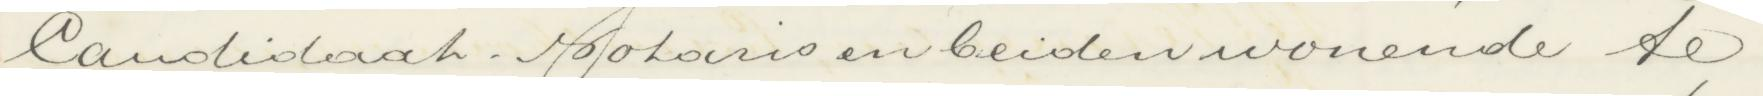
Candidaat - Notaris en beiden wonende te
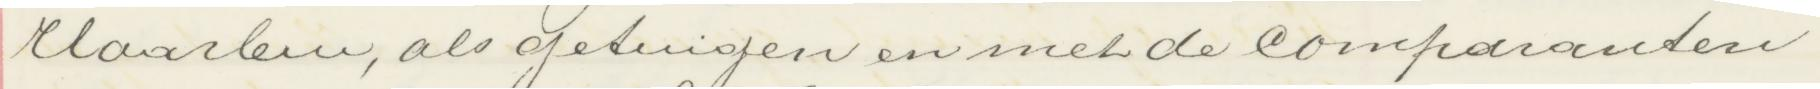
Haarlem, als getuigen en met de comparanten
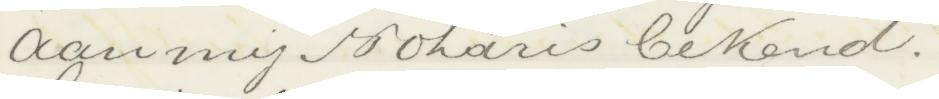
aan mij Notaris bekend.
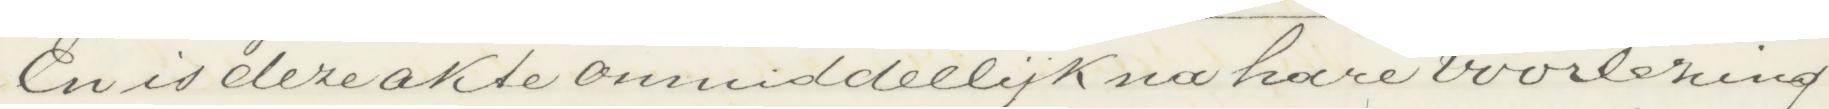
En is deze akte ommiddellijk na hare voorlezing
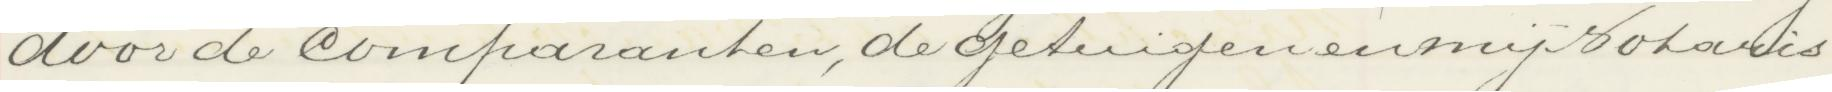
door de Comparanten, de getuigen en mij Notaris
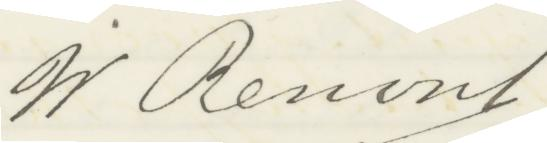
W Renout
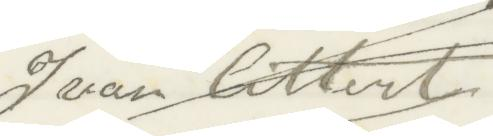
J van Cittert
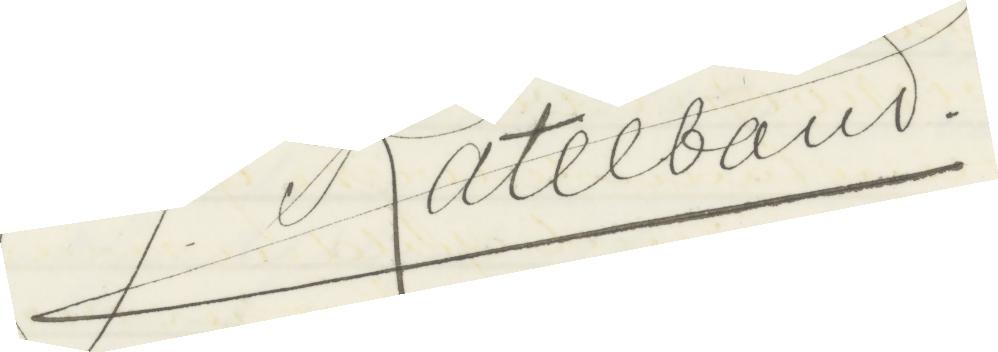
J. Ratelband -
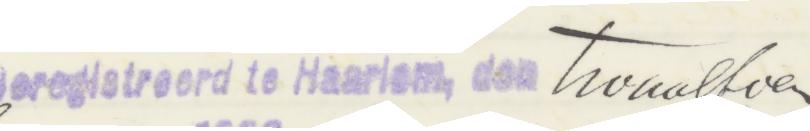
eregistreerd te Haarlem, den Twaalfden
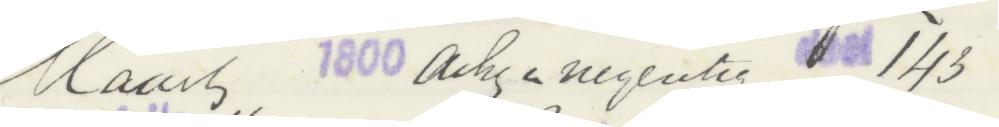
Maart 1800 acht en negentig deel 143
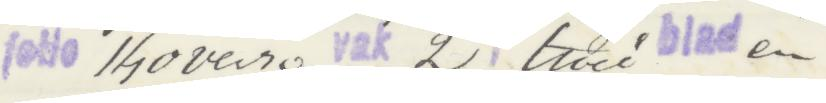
folio 140 verso vak 2 , twee blad en
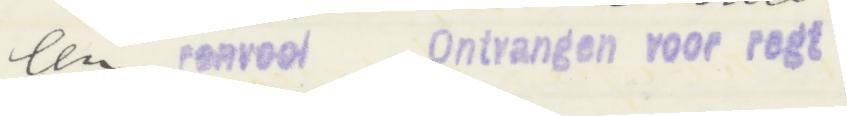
een renvooi . Ontvangen voor regt
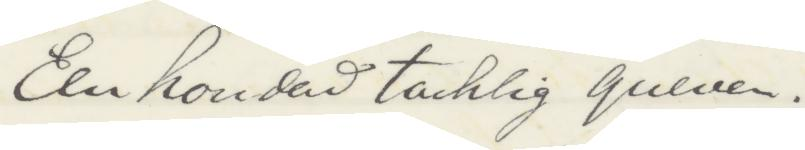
Een honderd tachtig gulden
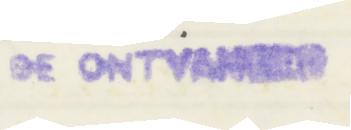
DE ONTVANGER
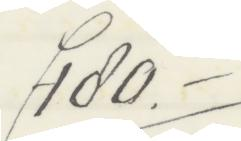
ƒ180.—
